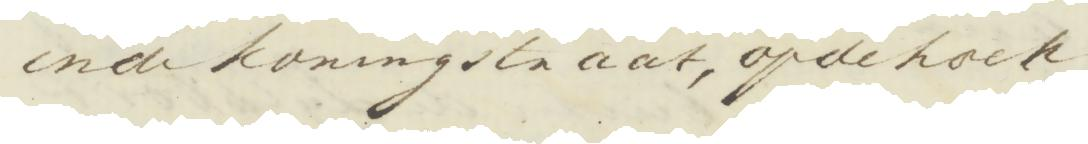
inde koningstraat, op de hoek
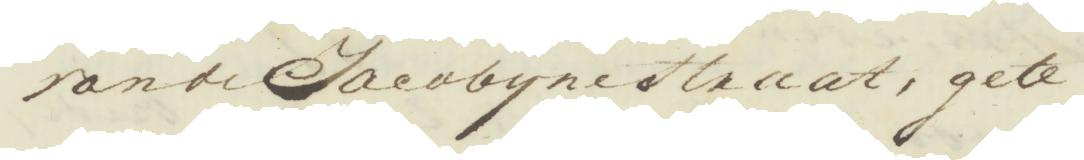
van de Iacobynestraat, gete
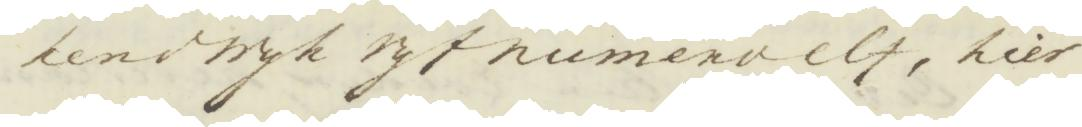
kend wyk vyf numero elf, hier
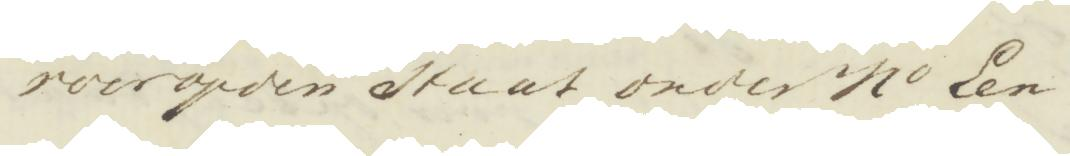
voor op den staat onder No Een
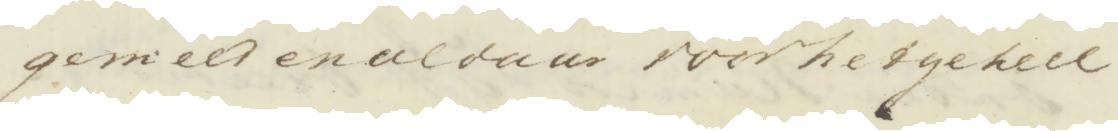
gemeld en aldaar voorhetgeheel
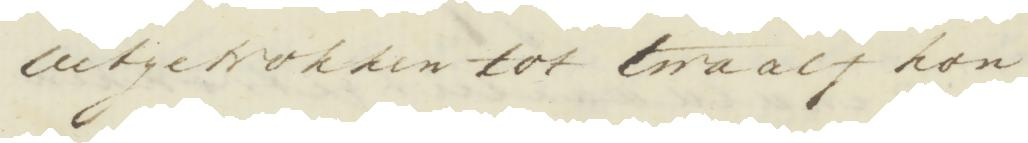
uitgetrokken tot twaalf hon
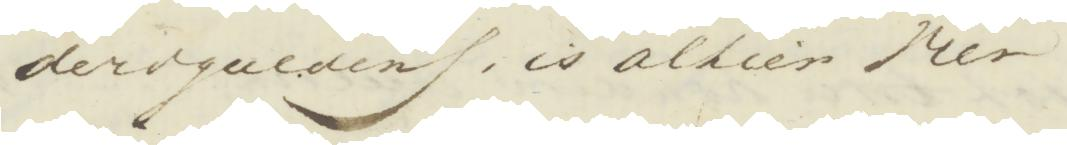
derd guldens, is alhier vier
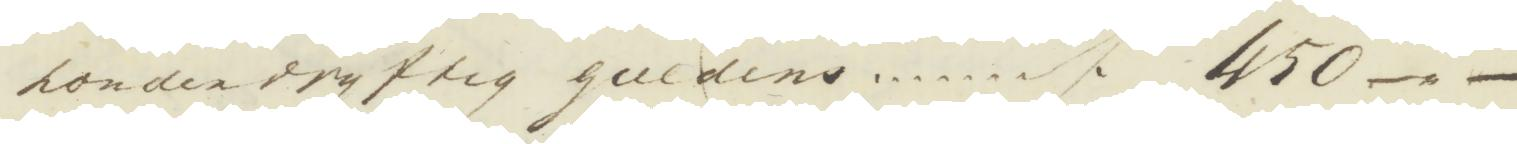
honderdvyftig guldens ƒ 450 —„ —
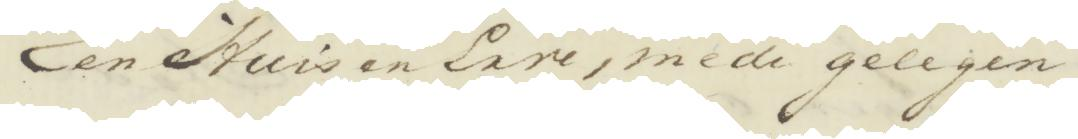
Een Huis en Erve, mede gelegen
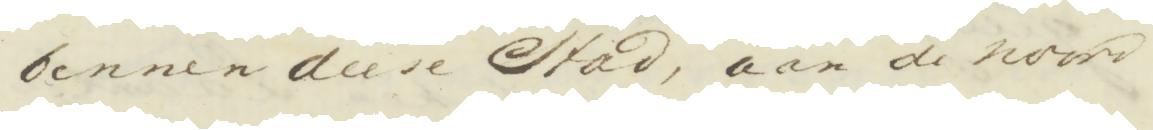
binnen deese Stad, aan de noord
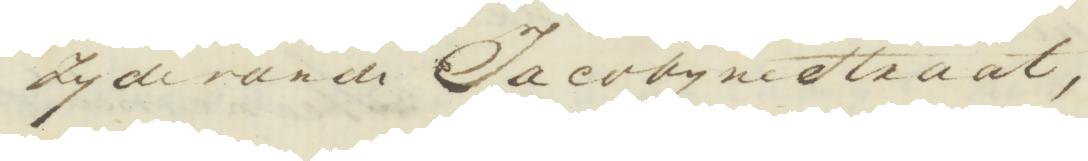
zyde van de Iacobnestraat,
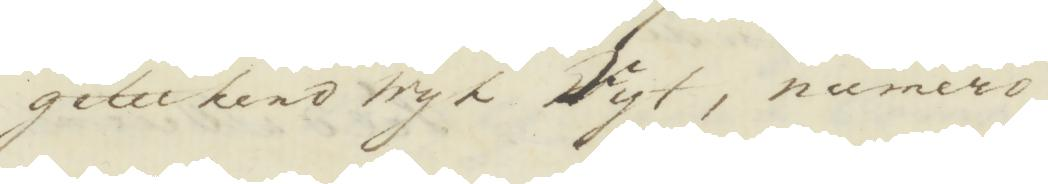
geteekend wyk Vyf, numero
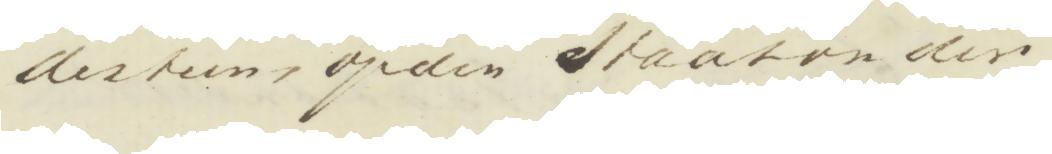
dertien, op den staat onder
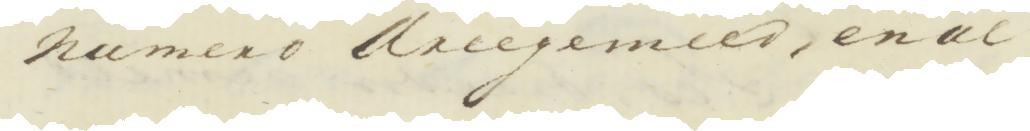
numero drie gemeld, en al
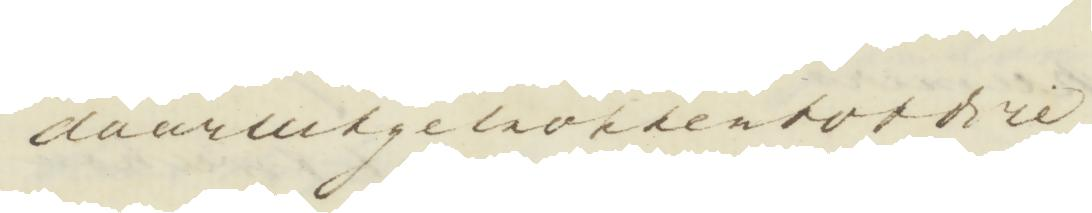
daaruitgetrokken tot drie
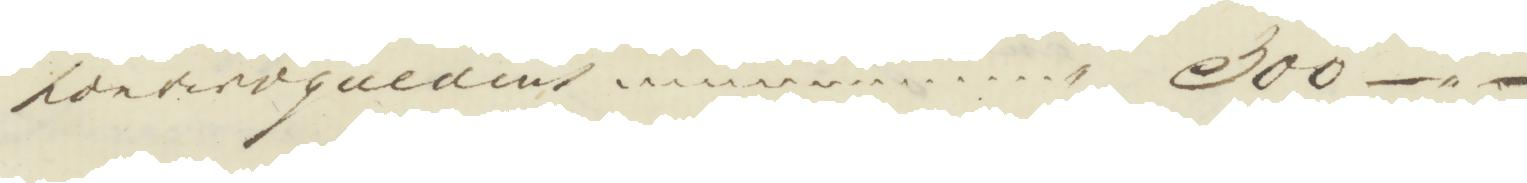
honderdguldens „ 300 —„ —
